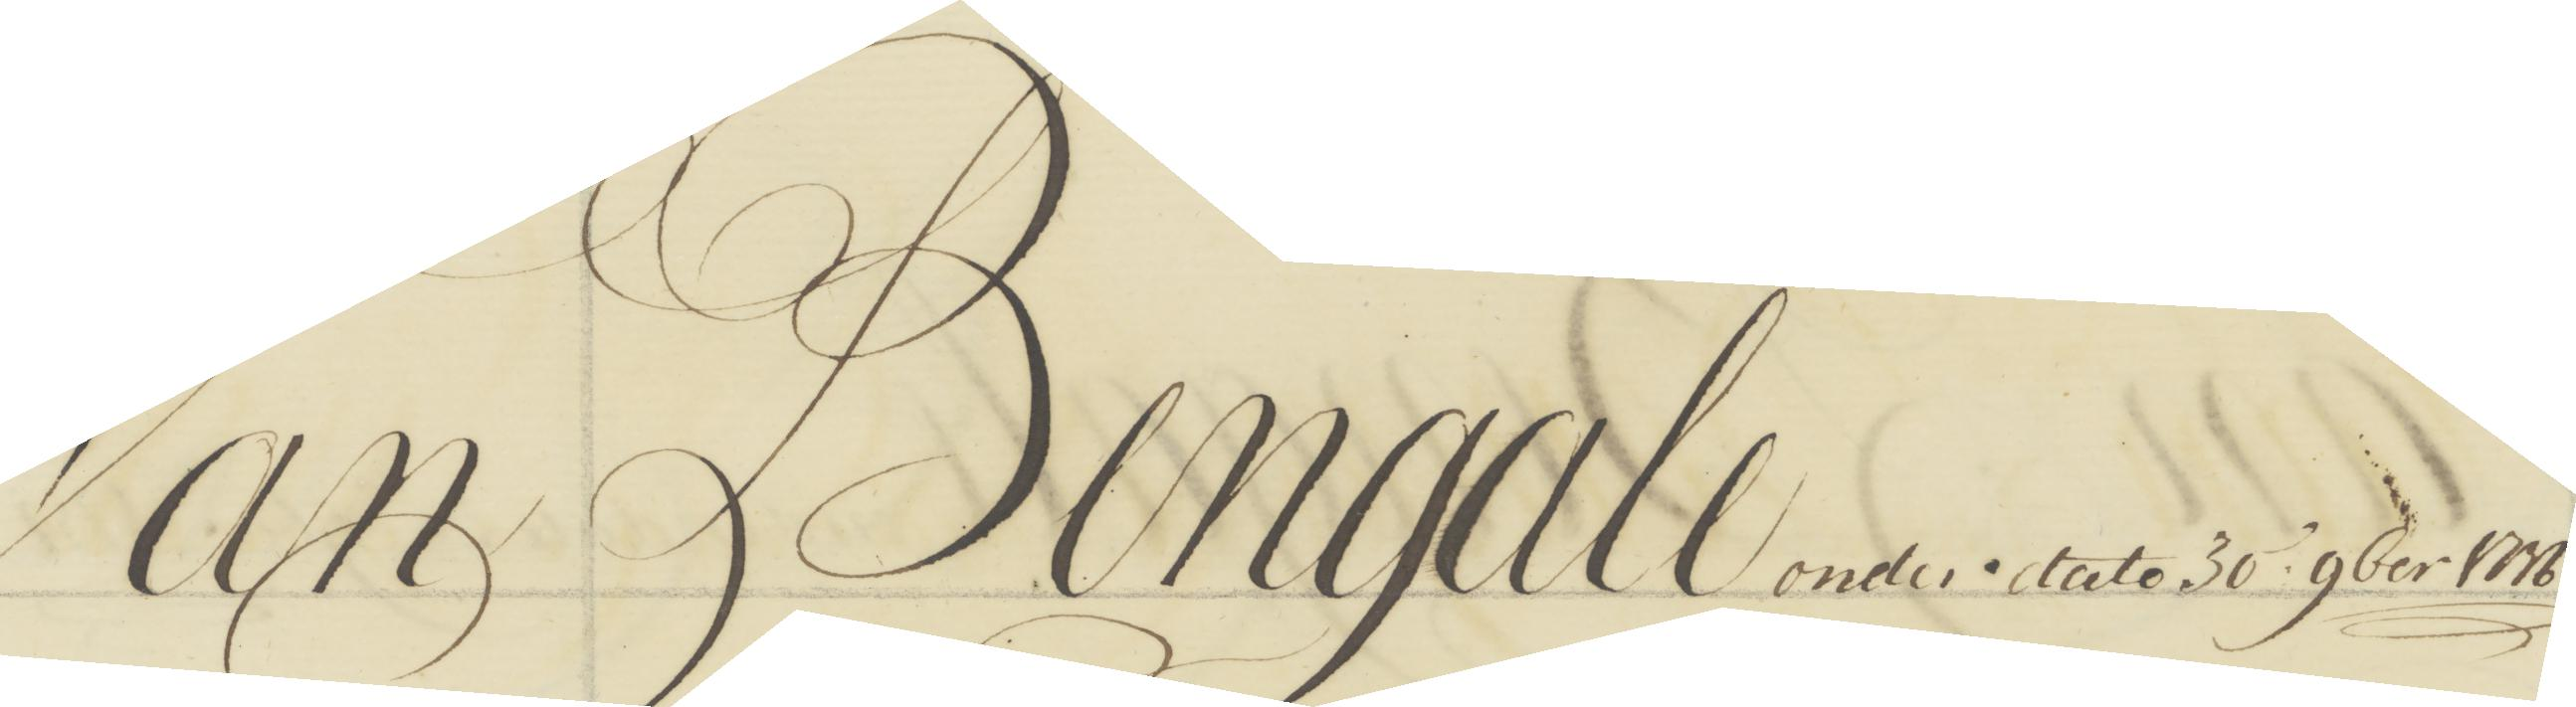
Van Bangale onder dato 30:' 9ber 1736
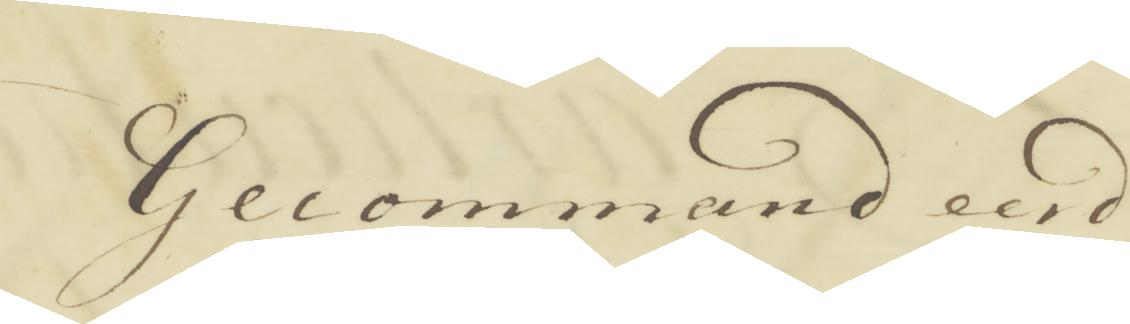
6: La Fortune Gecommandeerd
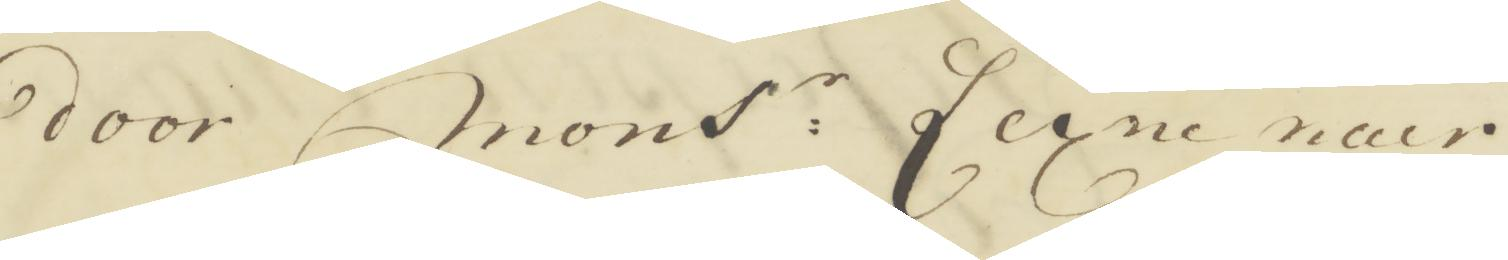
door mons:r Lexne naer
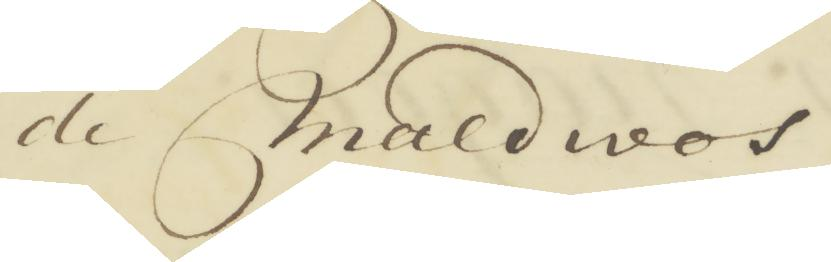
de Maldivos
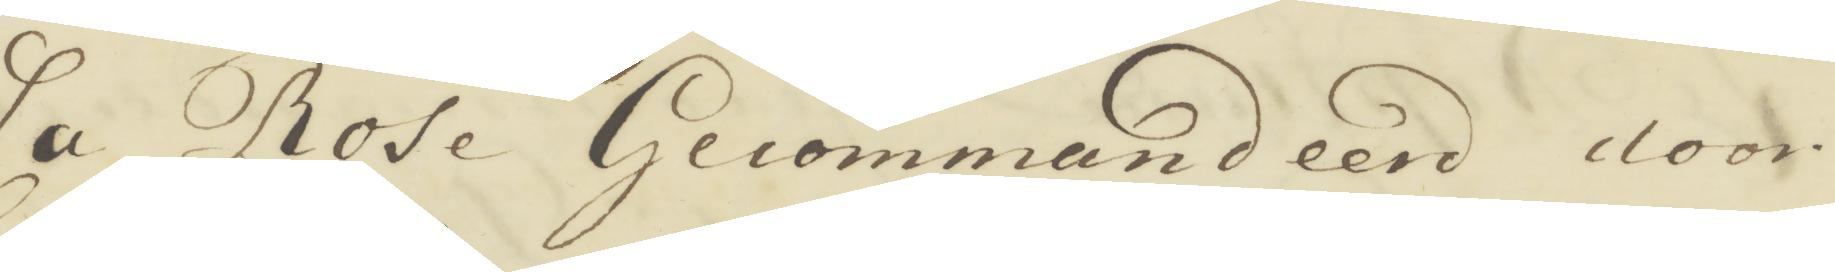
7 La Rose Gecommandeerd door
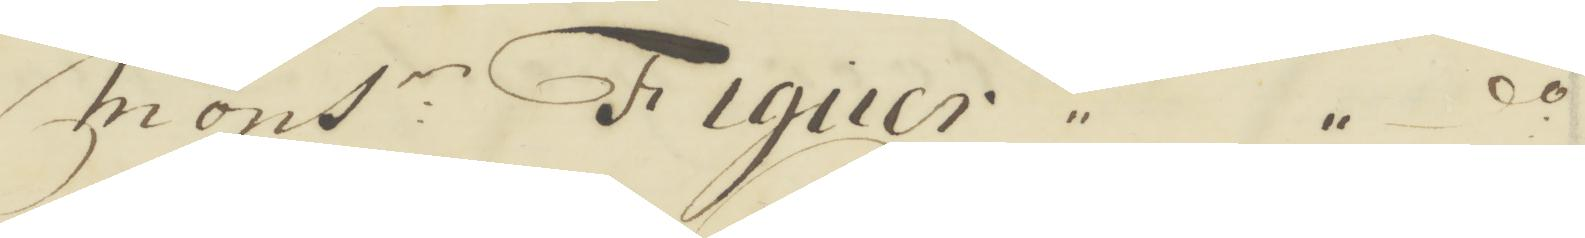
mons:r Figuer „ „ d:o
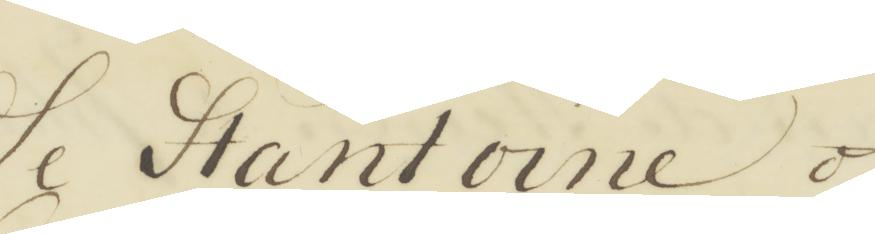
8 Le St antoine off Brigantijn
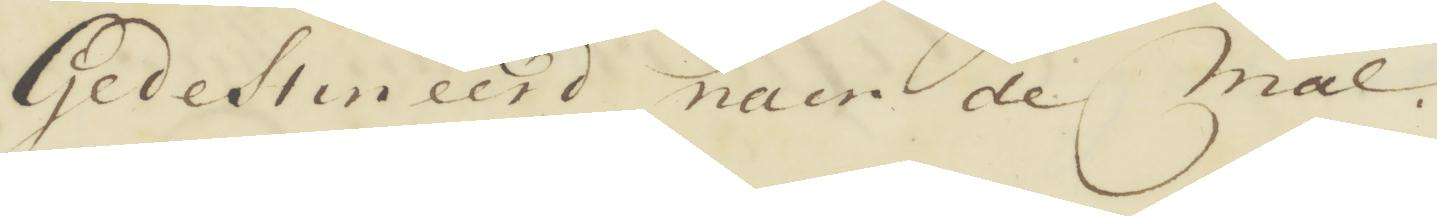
Gedestineerd naer de mal„
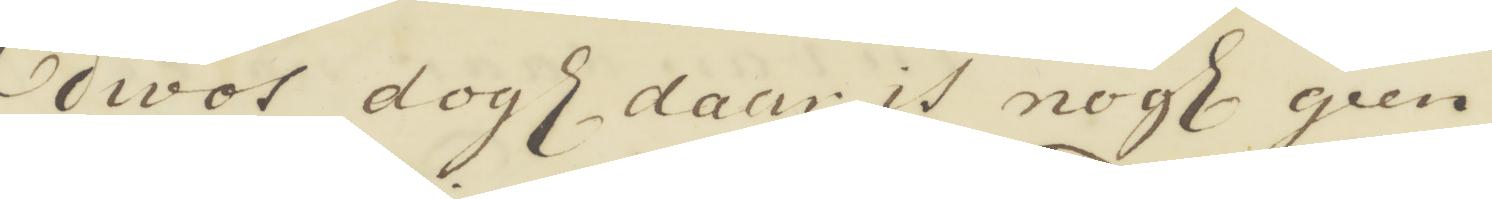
divos dogh daar is nogh geen
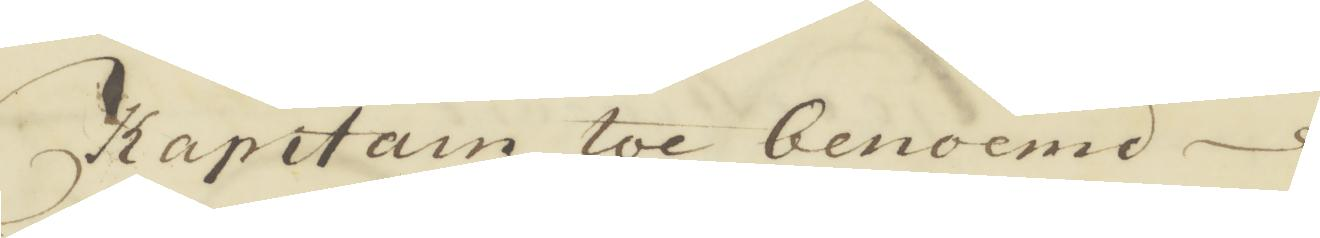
Kapitain toe benoemd
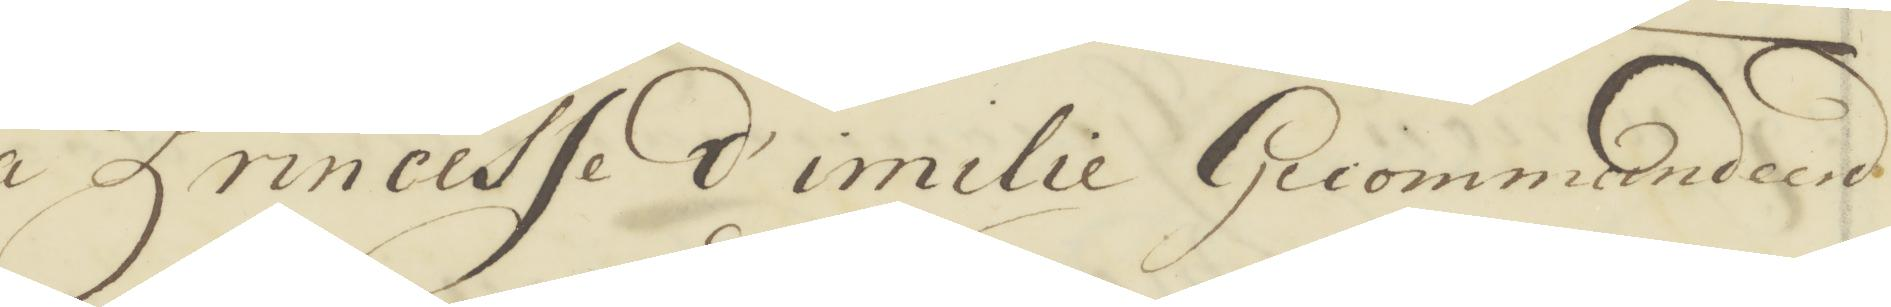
9 La Princesse d'imelie Gecommandeerd
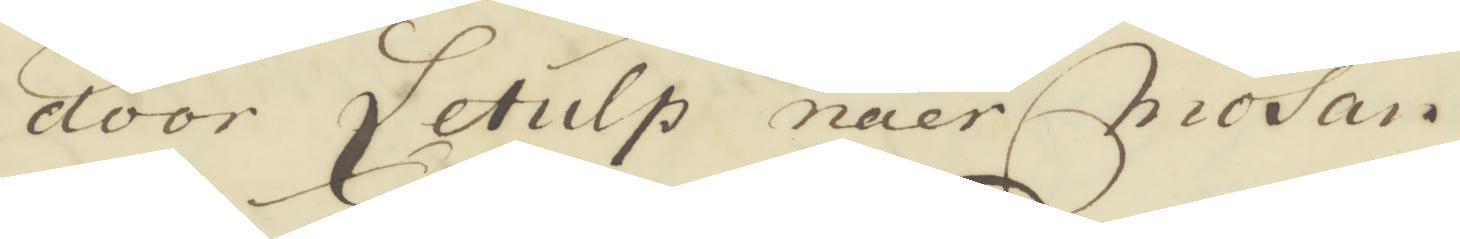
door Letulp naer mosan
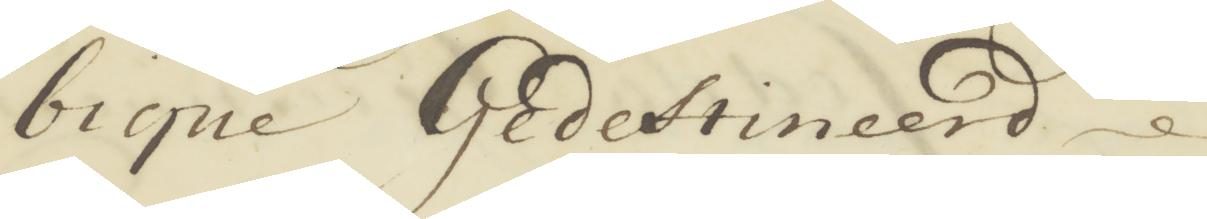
bique Gedestineerd
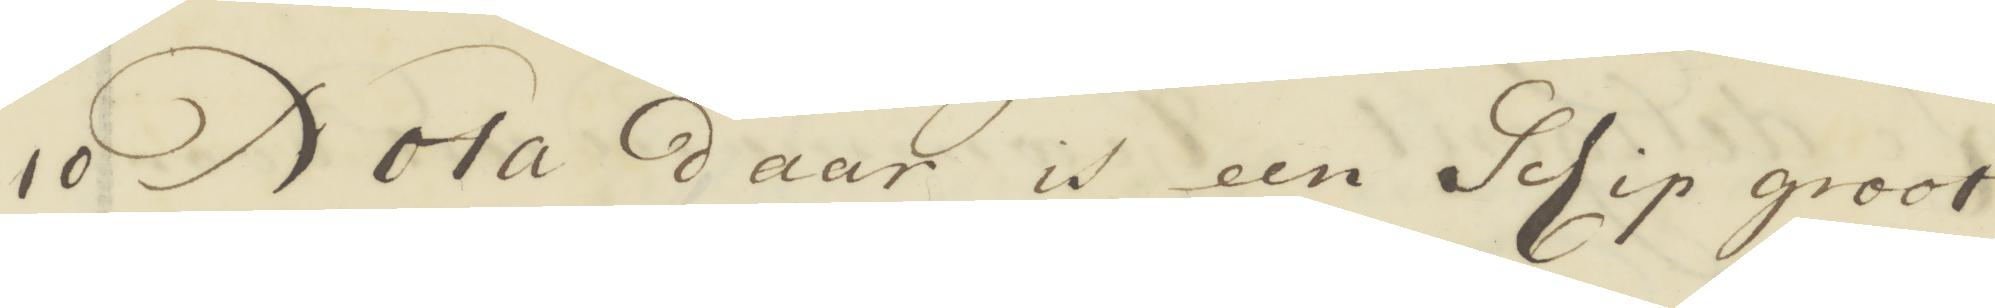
10 Nota daar is een schip groot
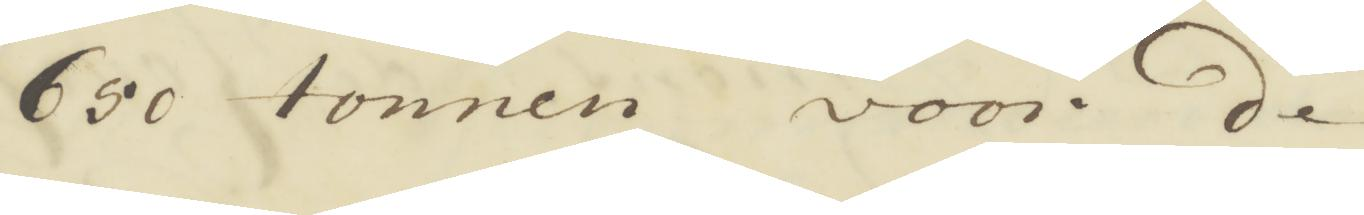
650 tonnen voor de
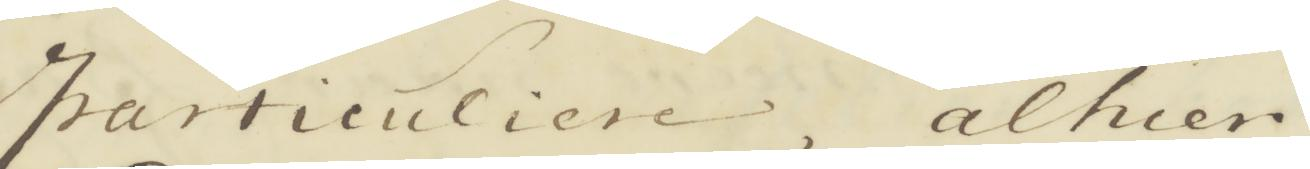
particuliere alhier
